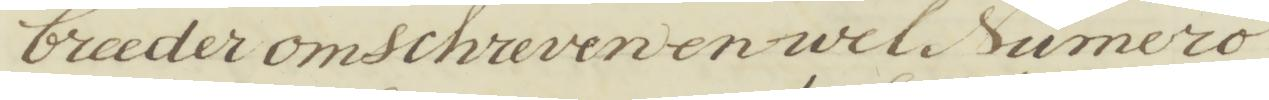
breeder omschreven en wel Numero
